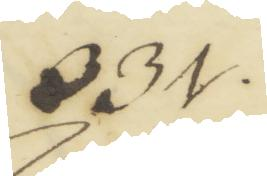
331.
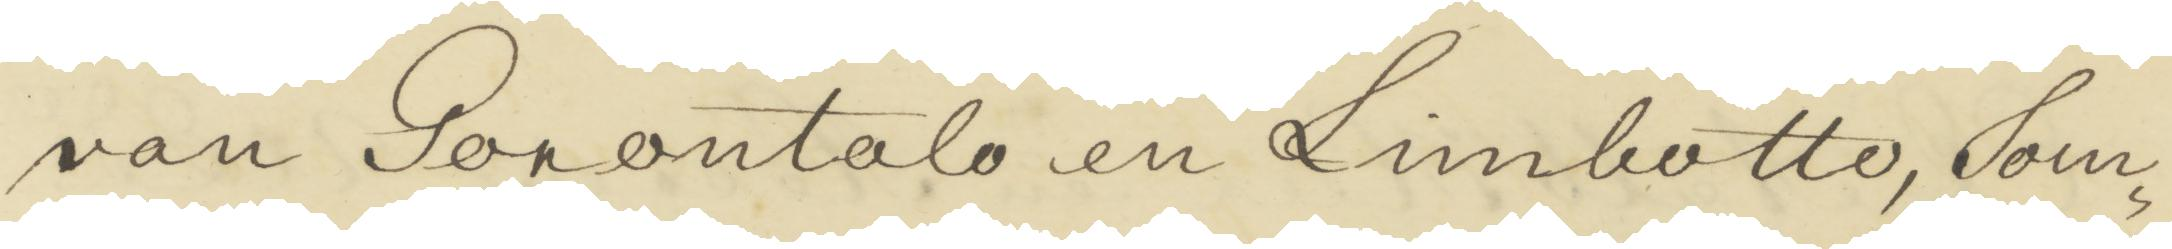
van Gorontalo en Limbotto, Som„
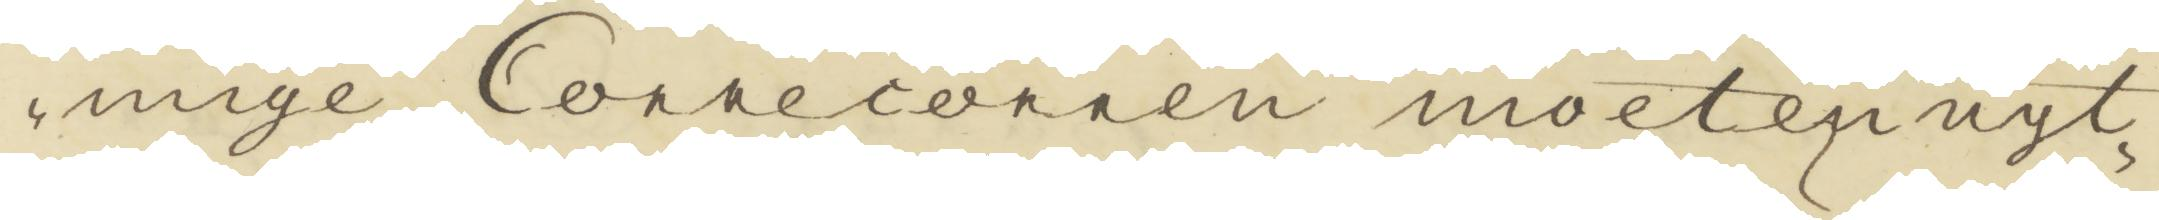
„mige Correcorren moeten uijt„
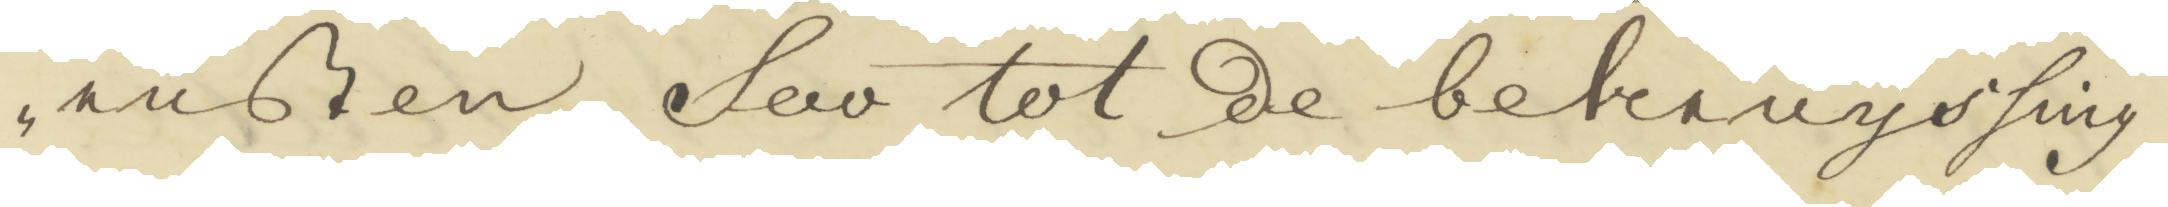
„rusten Soo tot de bekruijssing
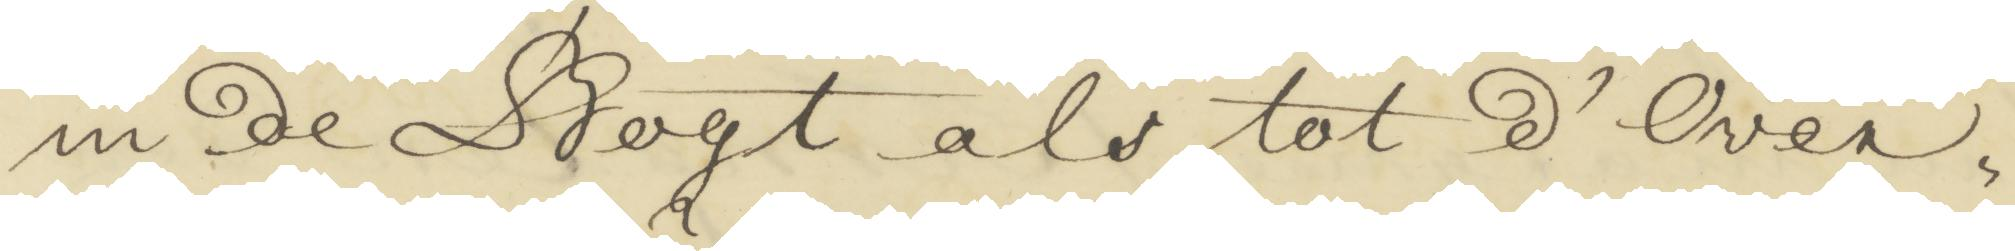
in de Bogt als tot d’ Over„
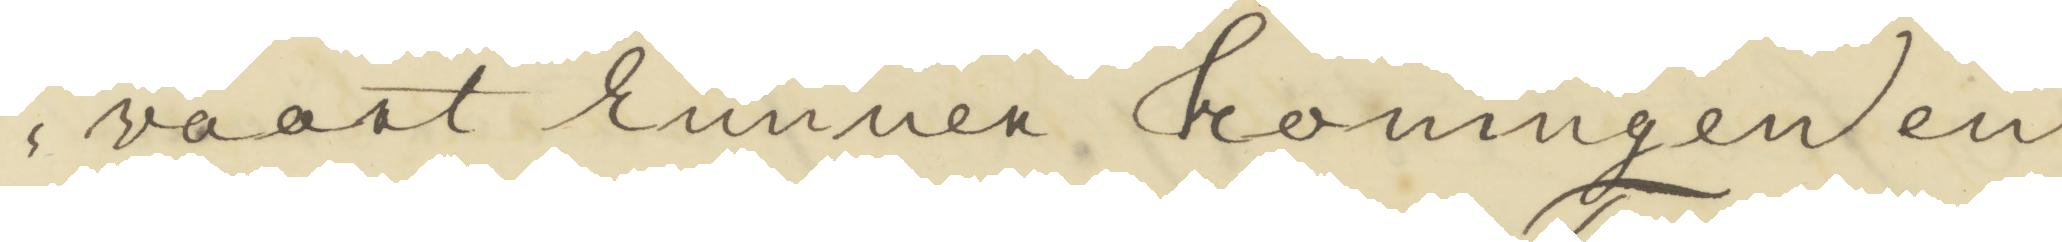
„vaart hunner koningen en
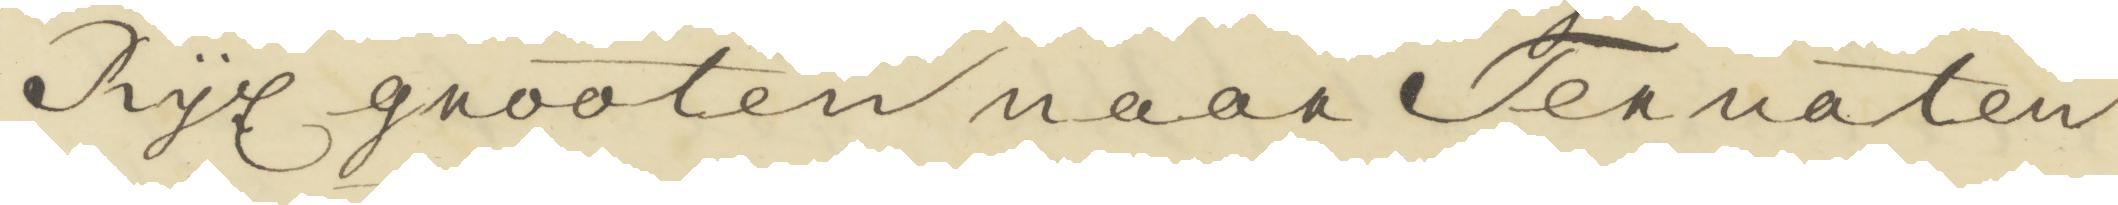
Rijx grooten naar Ternaten
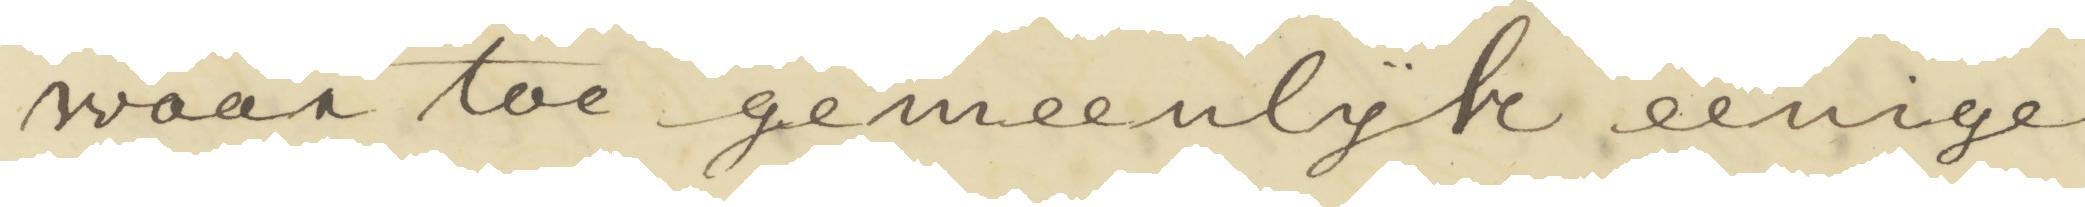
waar toe gemeenlijk eenige
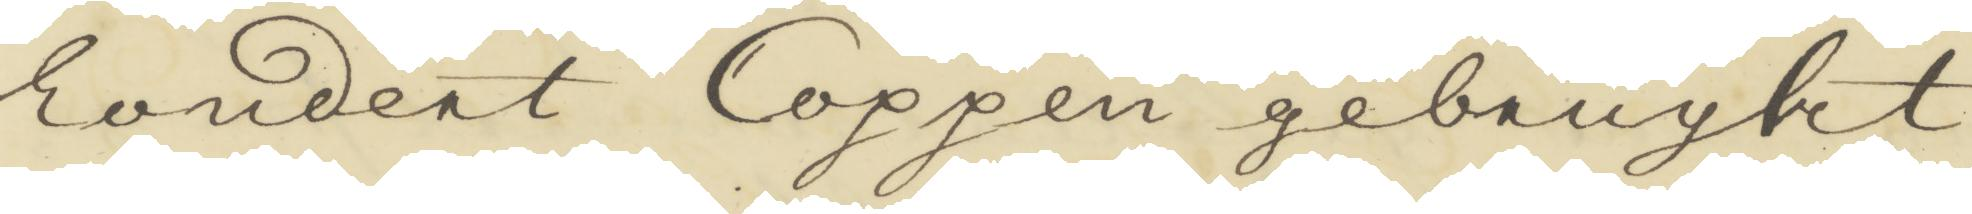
hondert Coppen gebruijkt
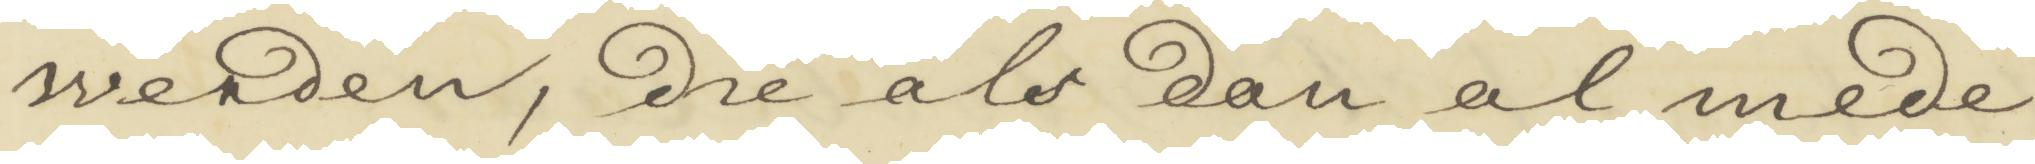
werden, die als dan al mede
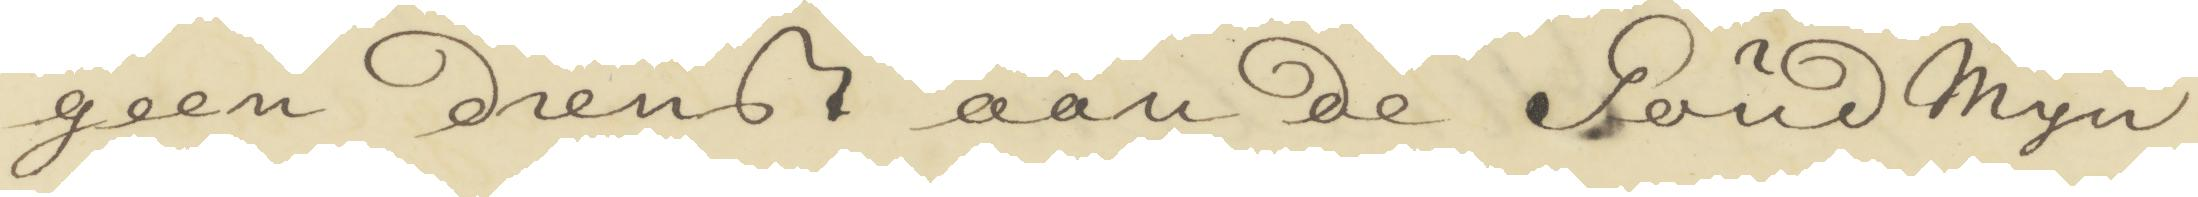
geen dienst aan de Goud Mijn
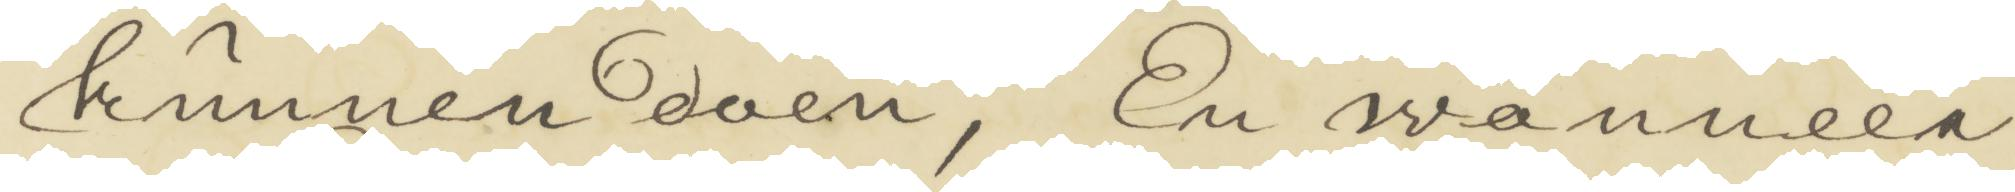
kunnen doen, En wanneer
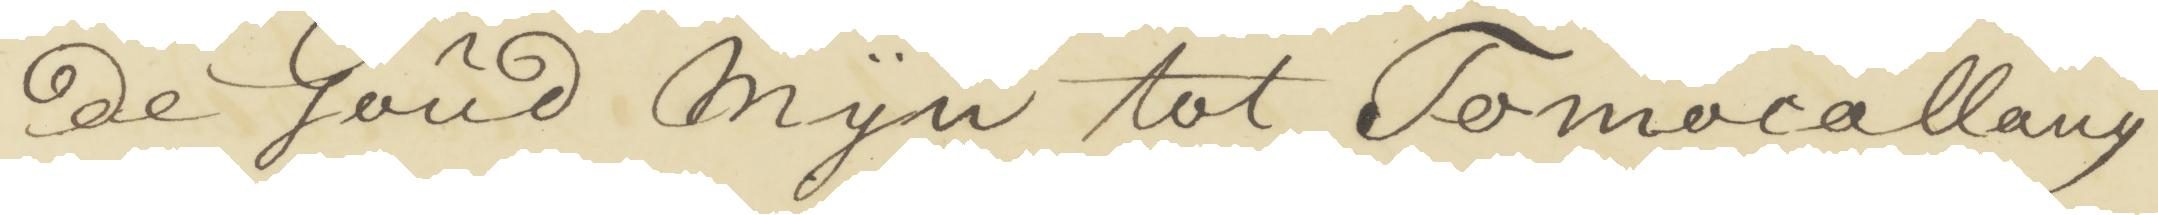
de Goud Mijn tot Tomocallang
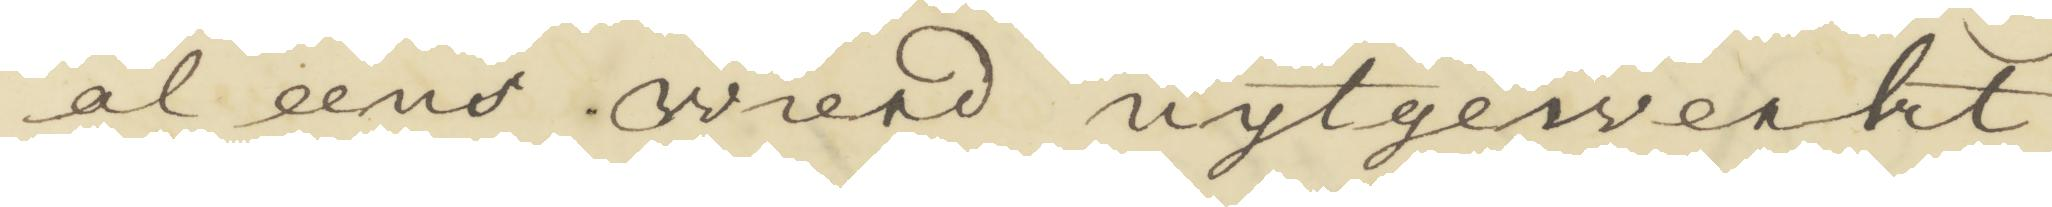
al eens wierd uijtgewerkt
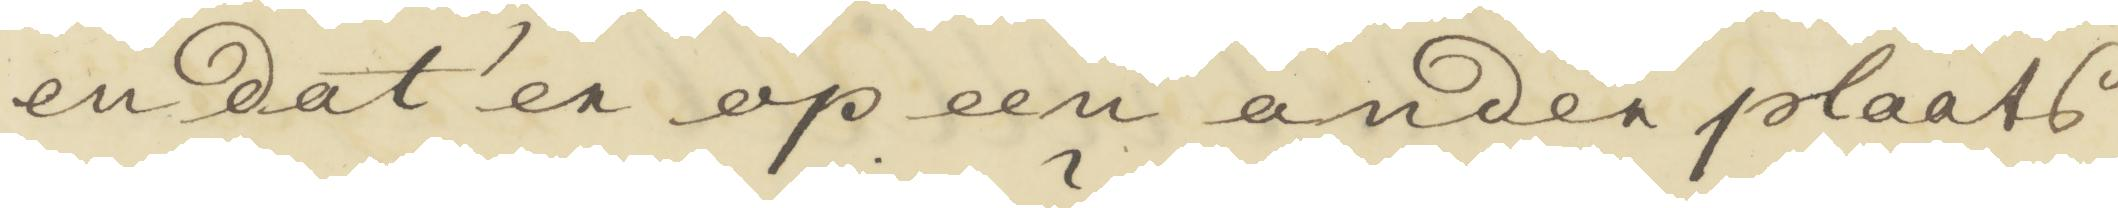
en dat 'er op een ander plaats
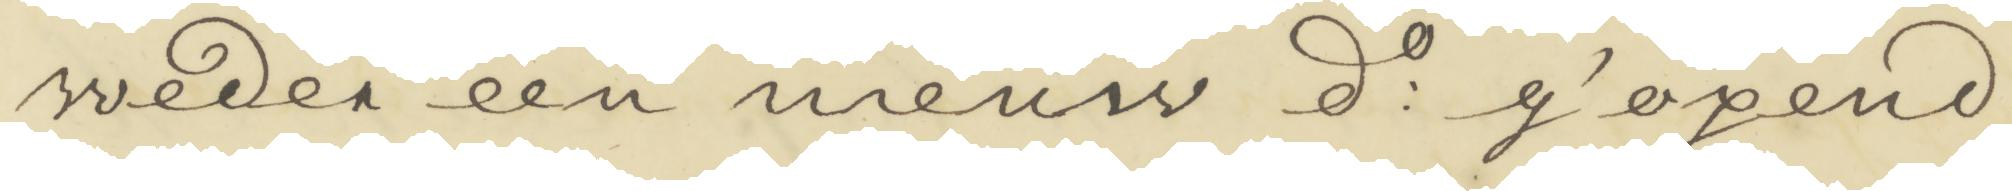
weder een nieuw d:o g'opend
